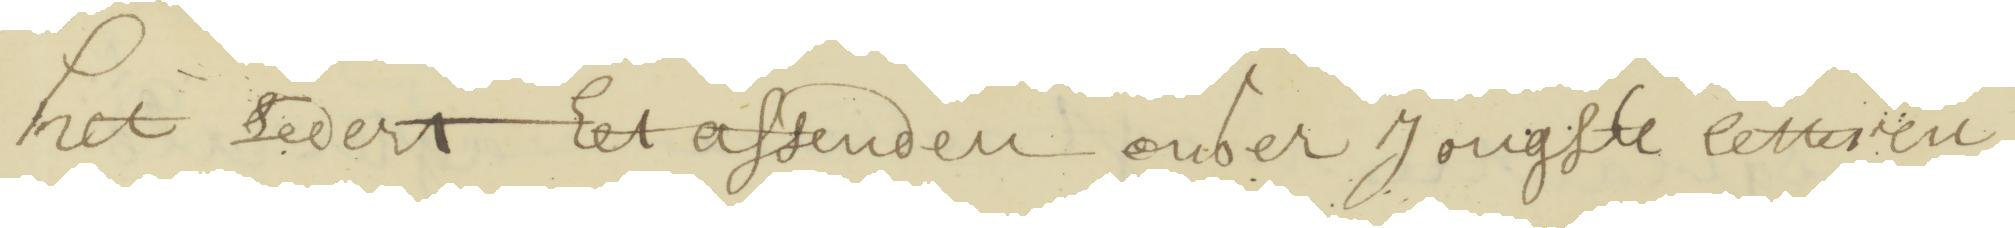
het sedert het afsenden onser Jongste letteren
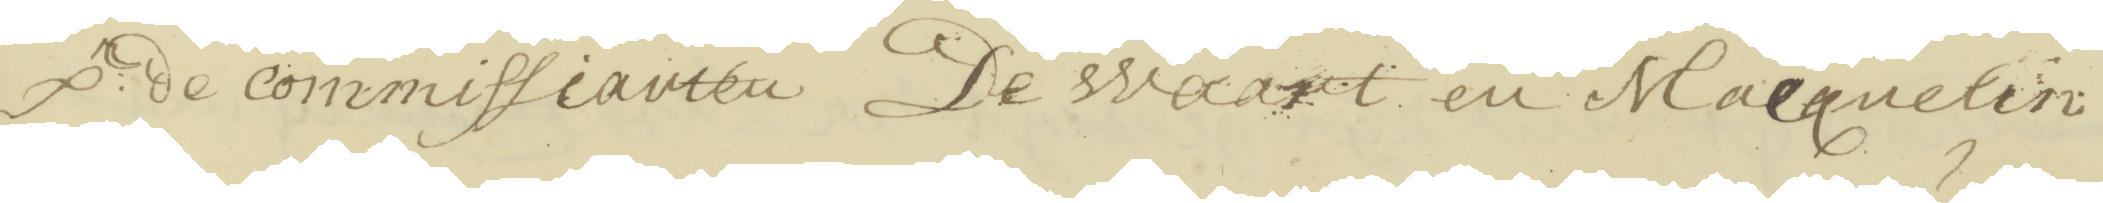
p:r de commissianten De waart en Macquelin
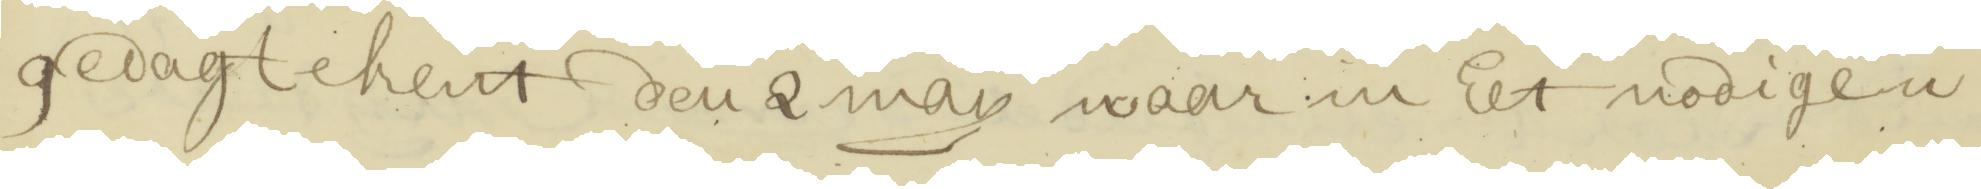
gedagtekent den 2 maij waar in het nodige u
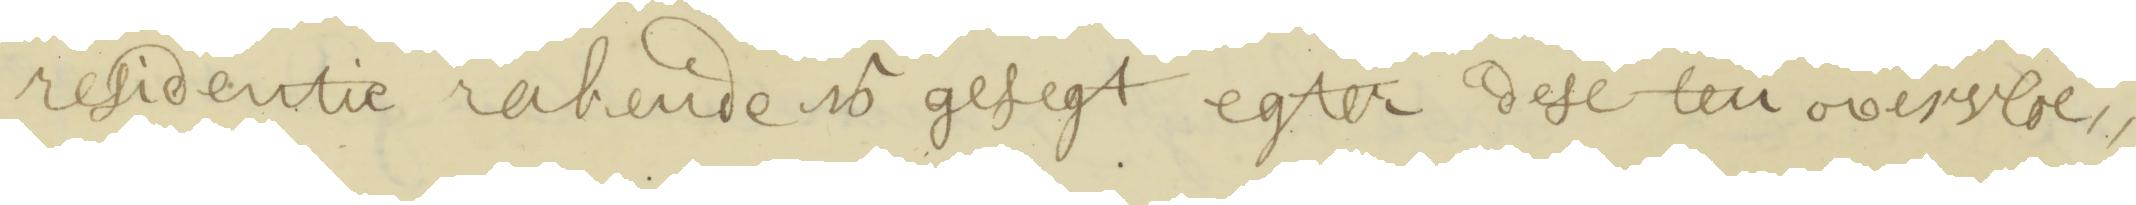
residentie rakende is gesegt egter dese ten overvloe„
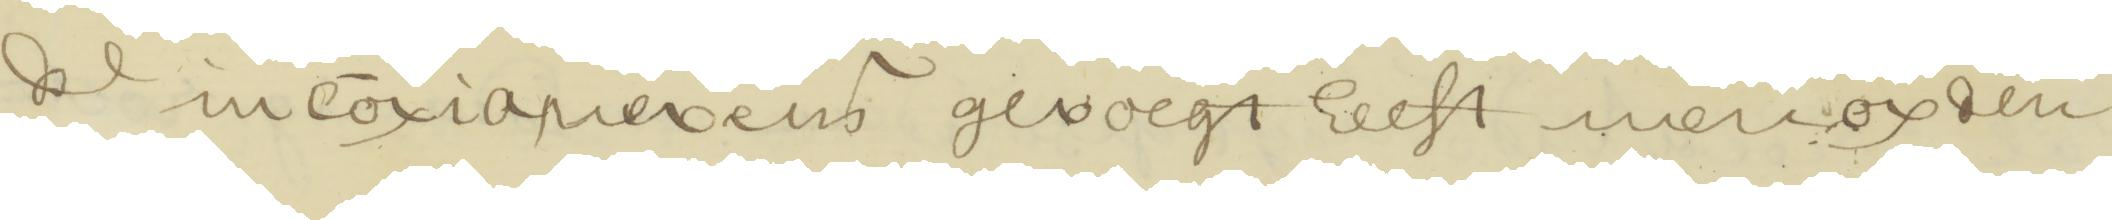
de in copia nevens gevoegt heeft men op den
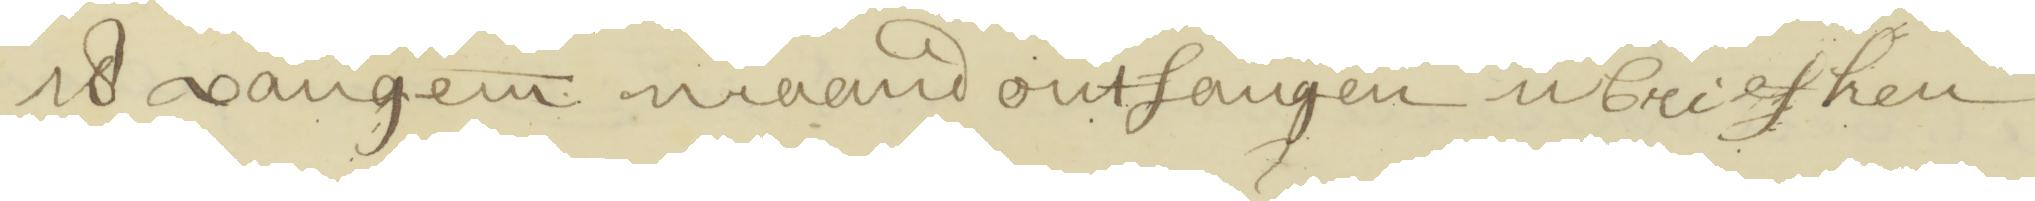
18 van gem: maand ontfangen u briefken
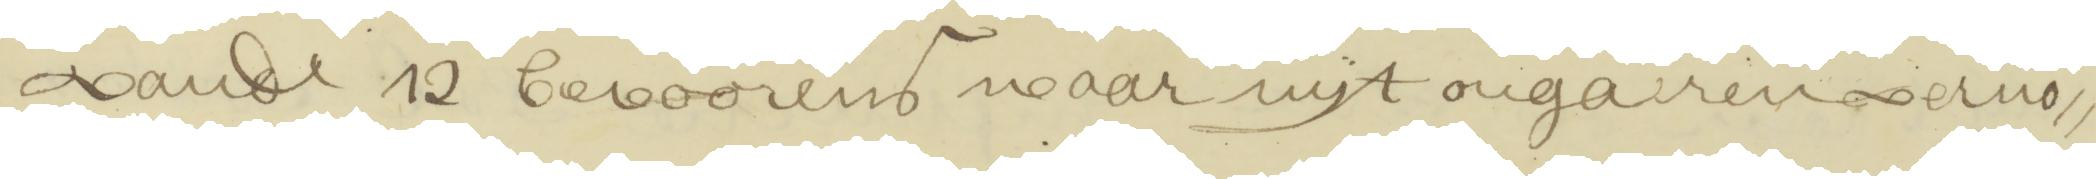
vande 12 bevoorens waar uijt ongaeren verno„
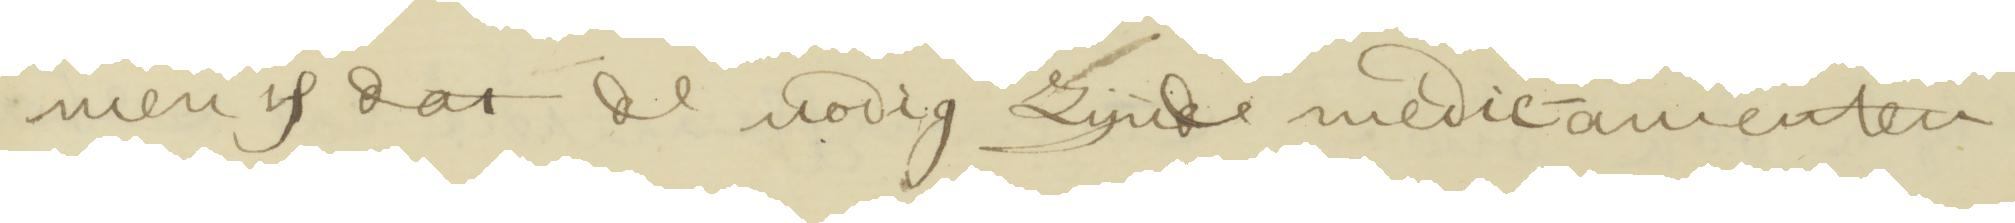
men is dat de nodig zijnde medicamenten
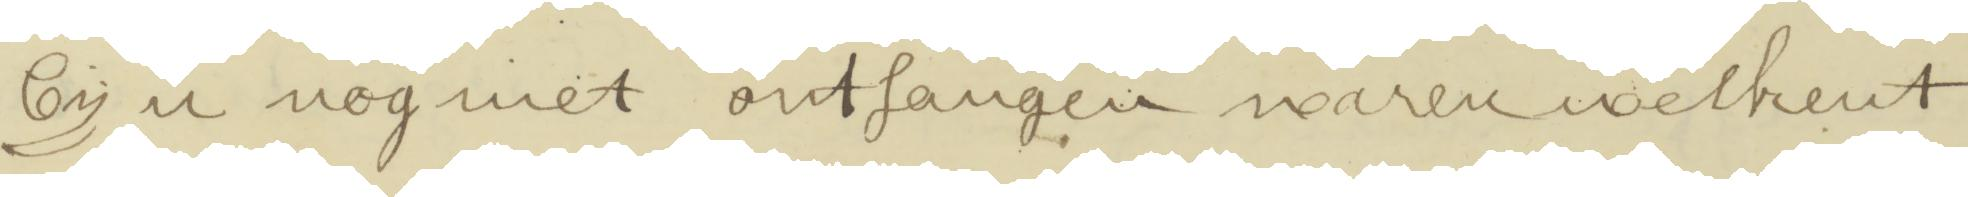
bij u nog niet ontfangen waren welkent
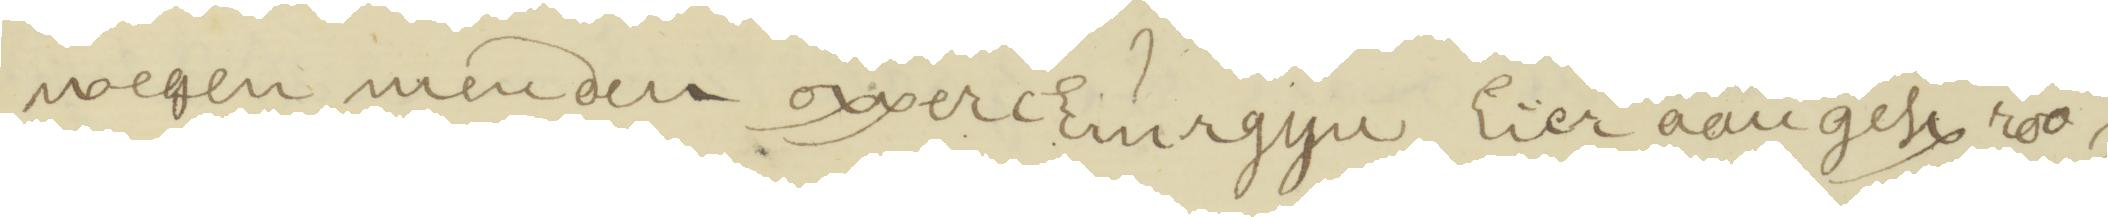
wegen men den opperchirurgijn hier aangekroo
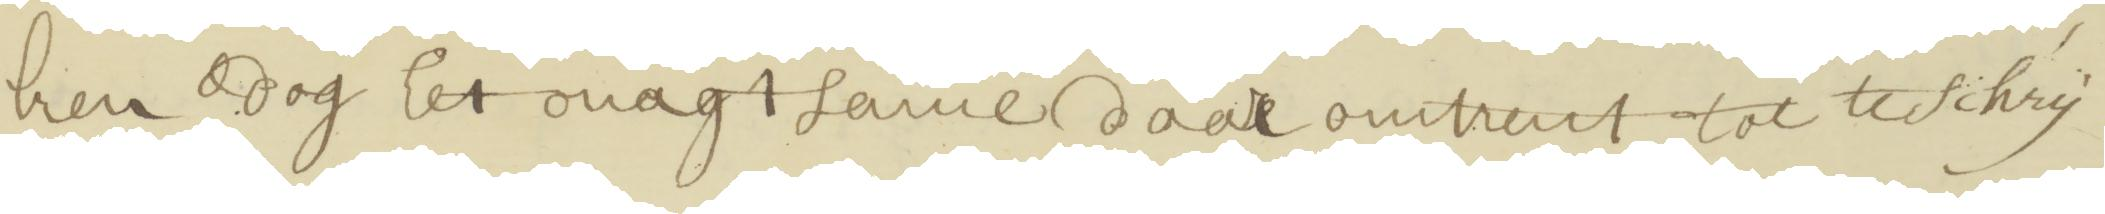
ken dog het onagtsame daar omtrent tot teschrij
